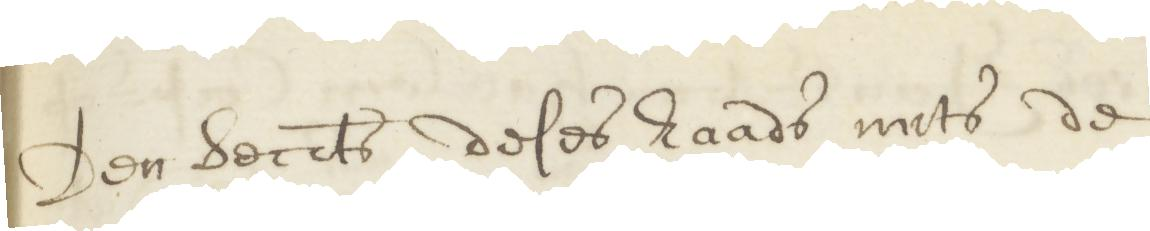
Den secrts deses raads mits de
